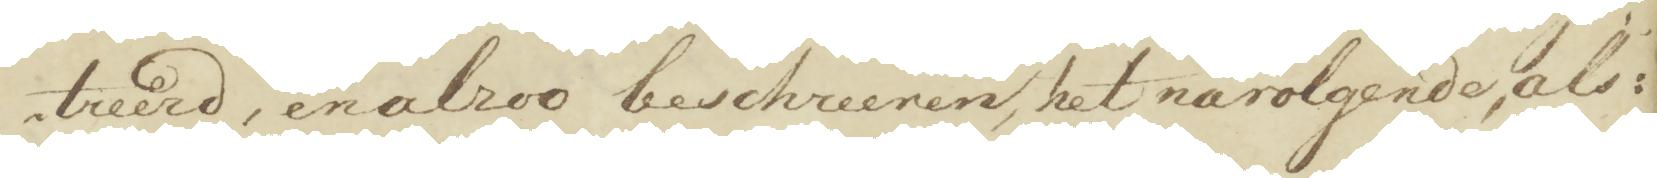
„treerd, en alzoo beschreeven, het navolgende, als:
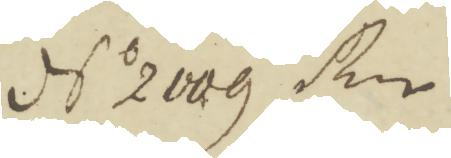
No 2009 Reg
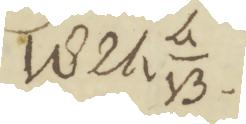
1824 4/13-
